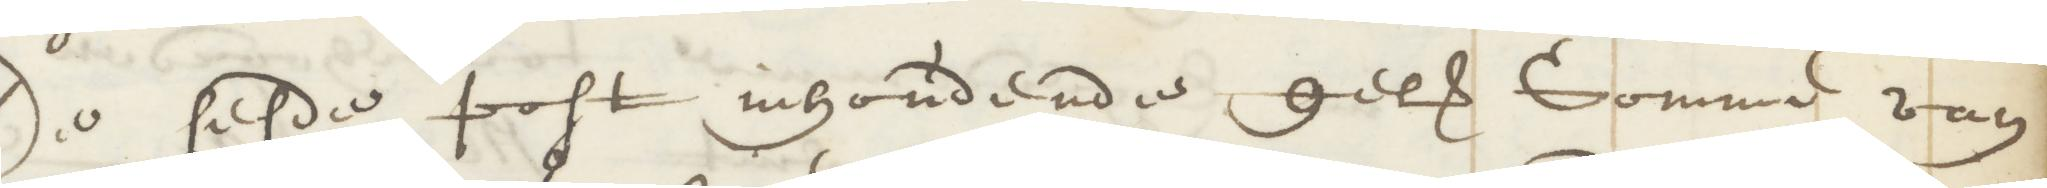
De sesde post inhoudende gelver Somme van
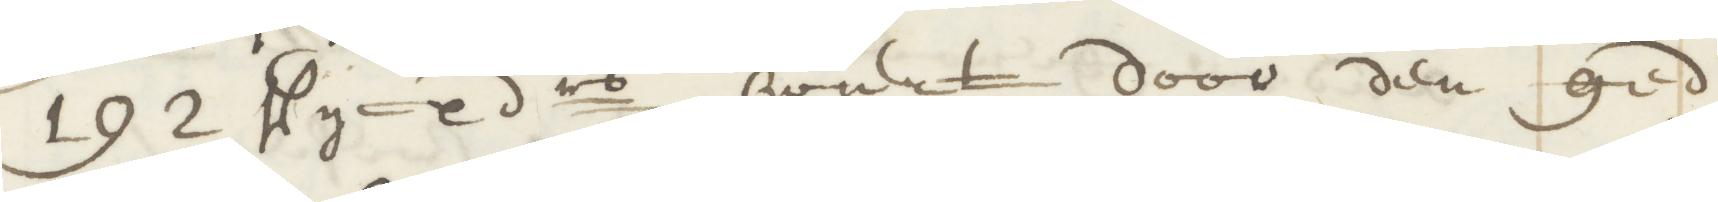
192 Rijcxd=rs wiert door den ged
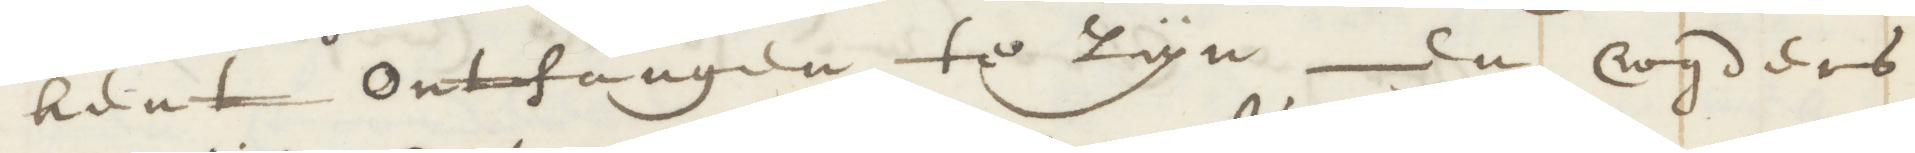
kent ontfangen te zijn en wijders
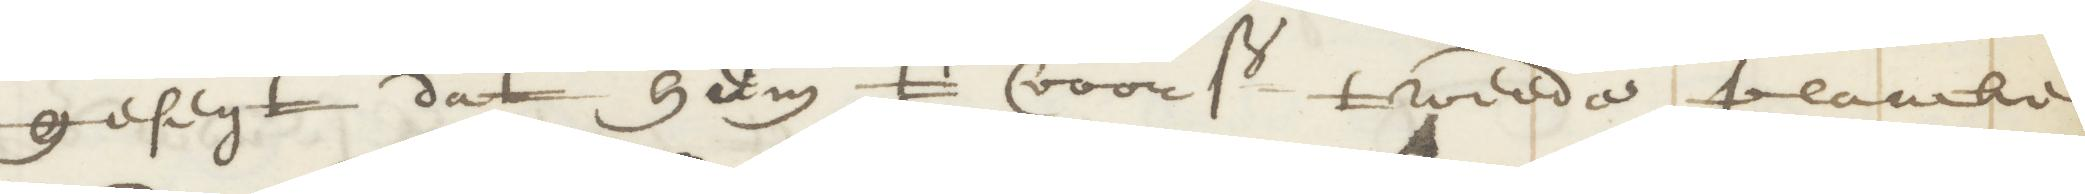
geseijt dat hem t' voorsz tweede plancke
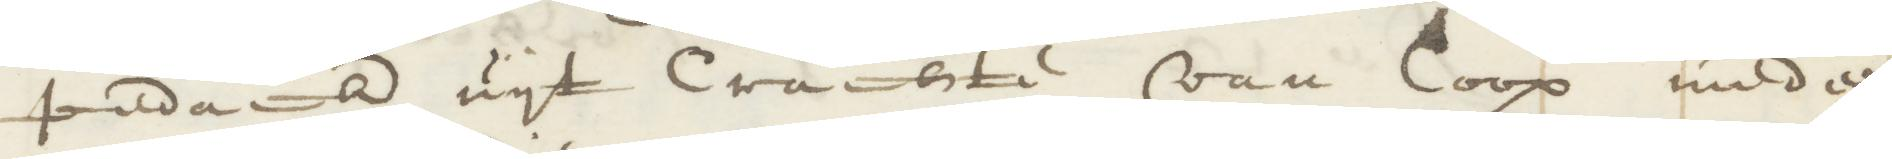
pedack uijt Crachte van Coop mede
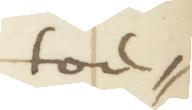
toe„
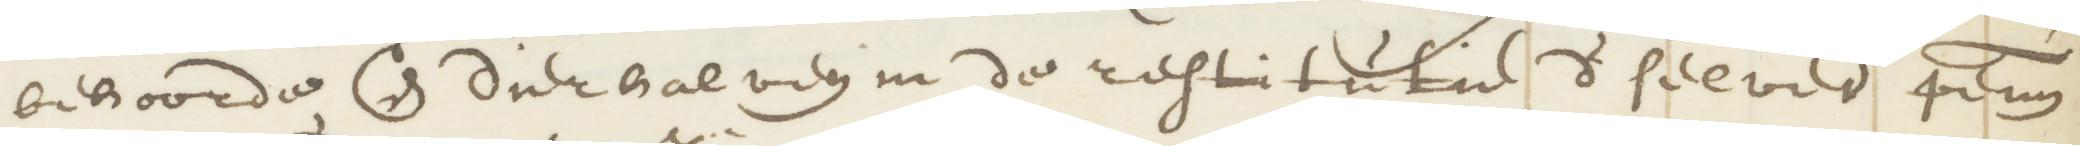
behoorde ende dierhalven in de restitutie d’ selven penn
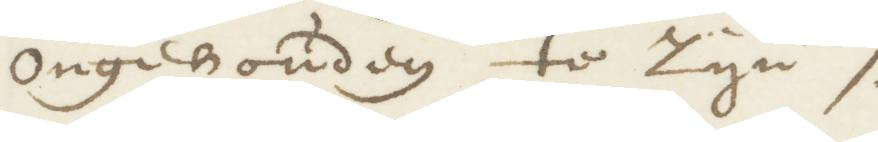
ongehouden te zijn/
